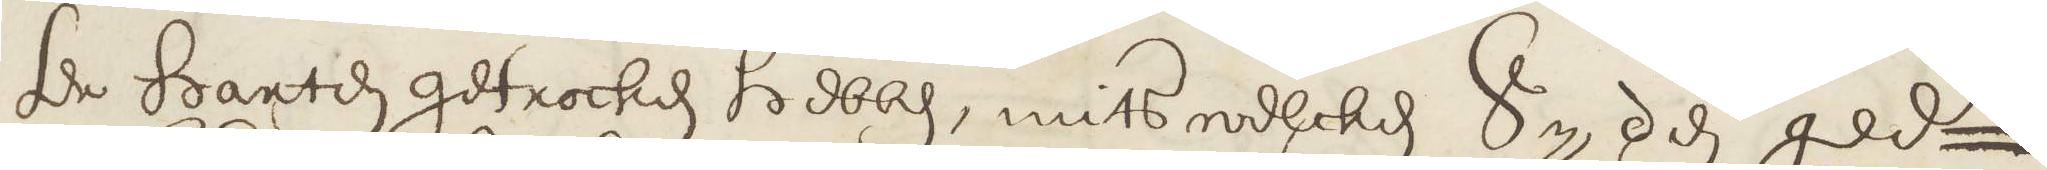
ter harten getrocken hebben, mits welcken sy den ged=e
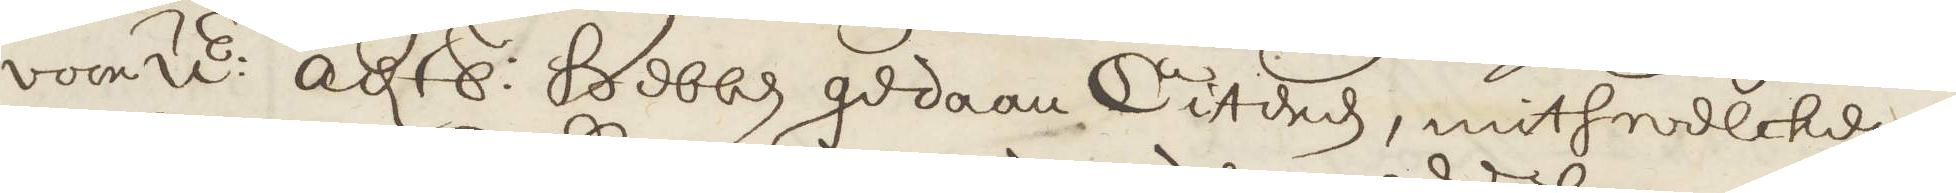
voor UE: achtb: hebben gedaan Citeren, mitswelcken
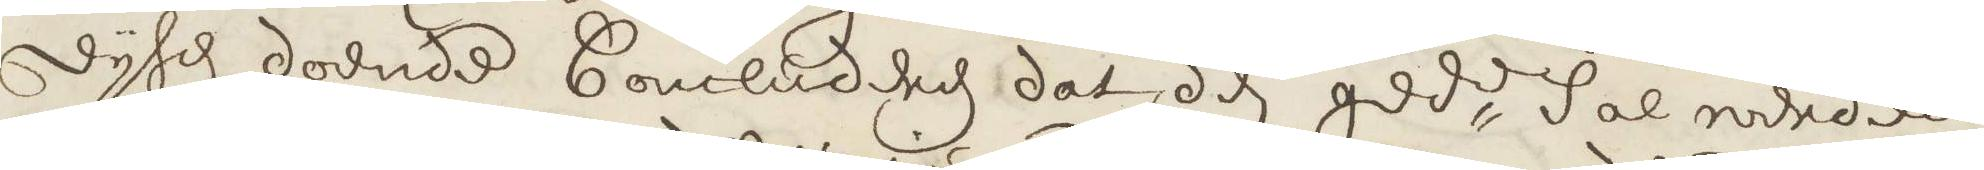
eijsch doende Concluderen dat den ged„e sal werden
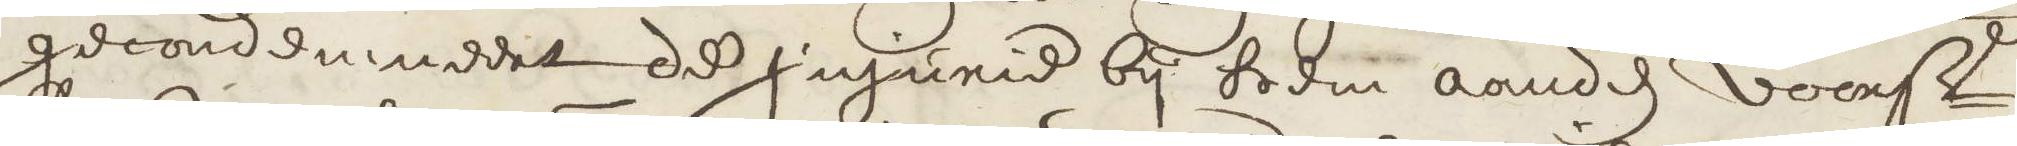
gecondemneert de jnjurie bij hem aanden voors=z
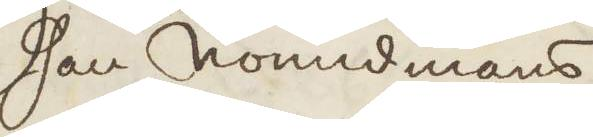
Jan nonnemans
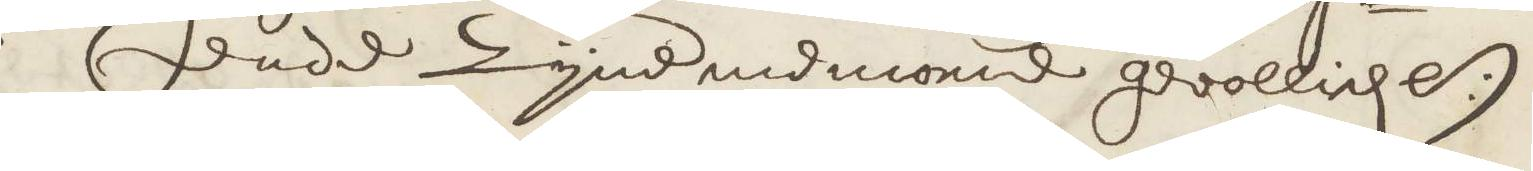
ende zijne memorie gevoelichlijk
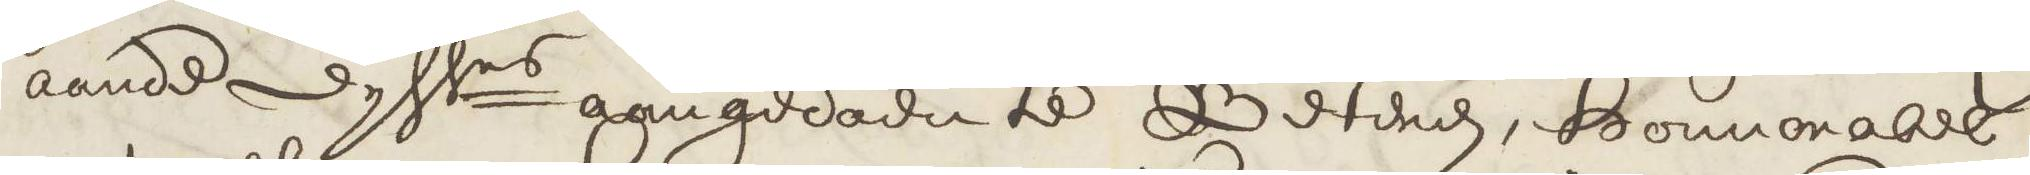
aande Eyss=rs aangedaen te Beteren, honnorabel
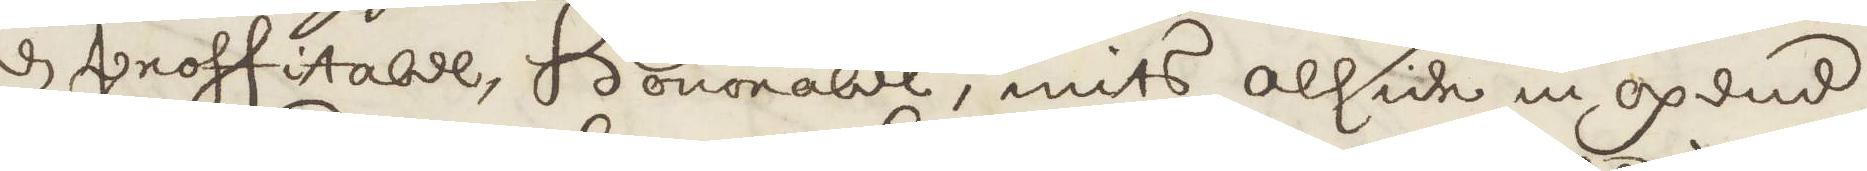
en proffitabel, Honorabel, mits alhier in opene
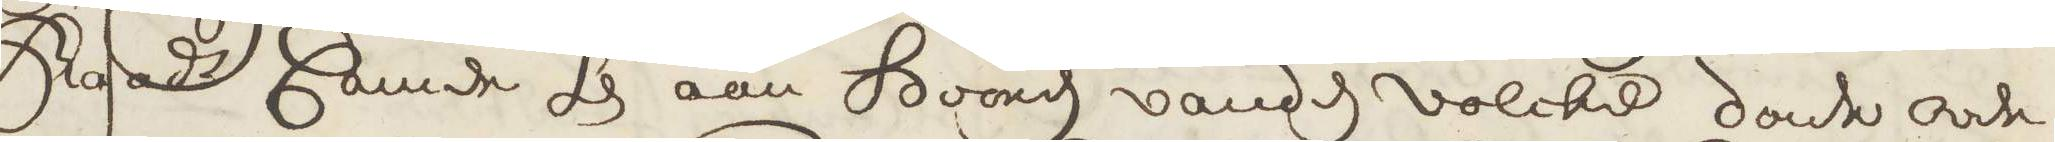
Raadt Camer ten aan hooren vanden volcke daer over
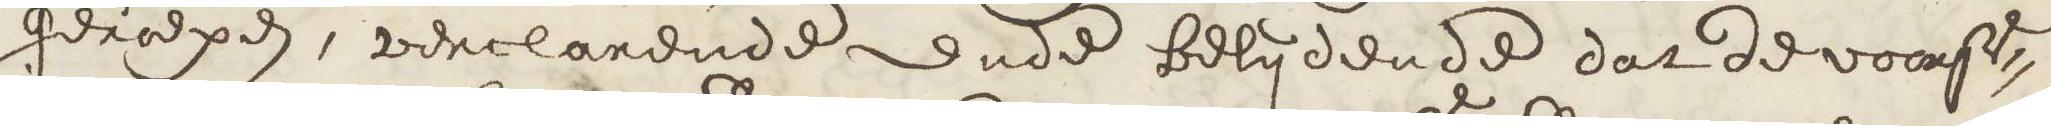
geroepen, verclarende ende belijdende dat de voorsz„e
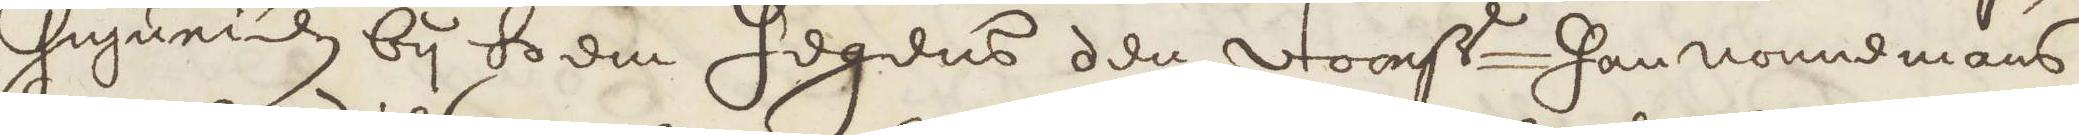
Jnjurien bij hem Jegens den voorsz=e Jan nonnemans
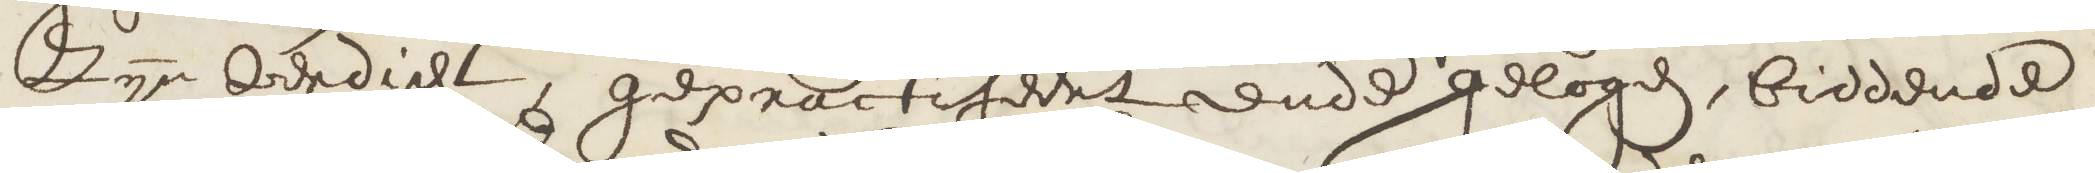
zijn verdicht, gepractiseert ende gelogen, biddende
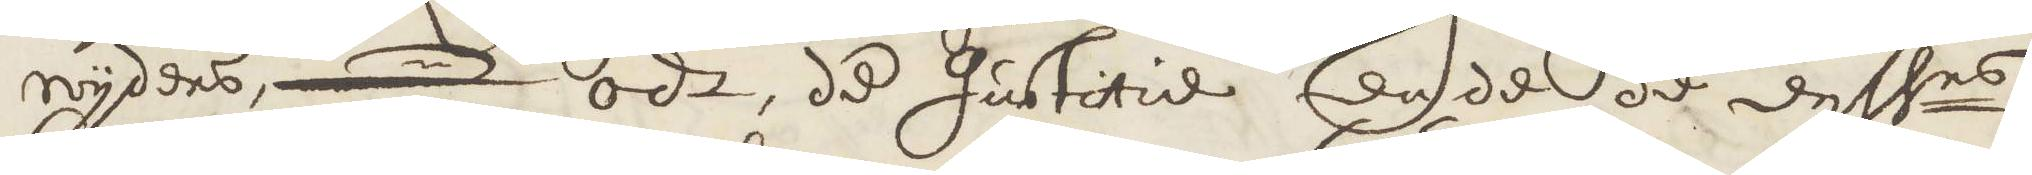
wijders, Godt, de Justitie ende de eyss=rs
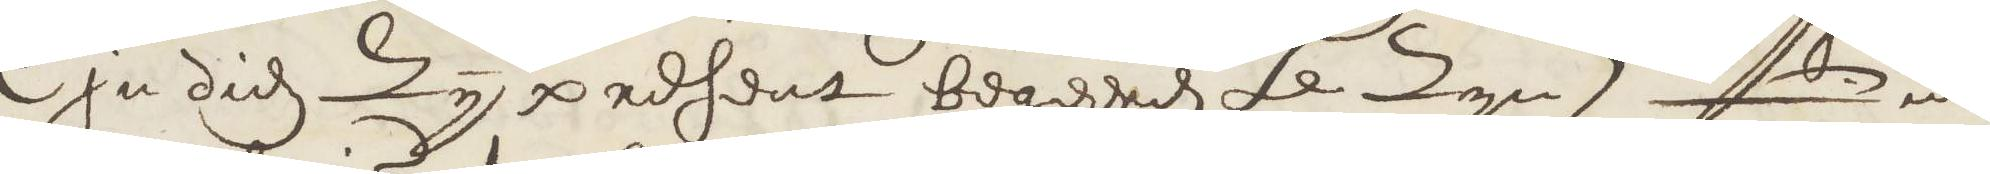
( jn dien zij present begeeren te zyn ) Om
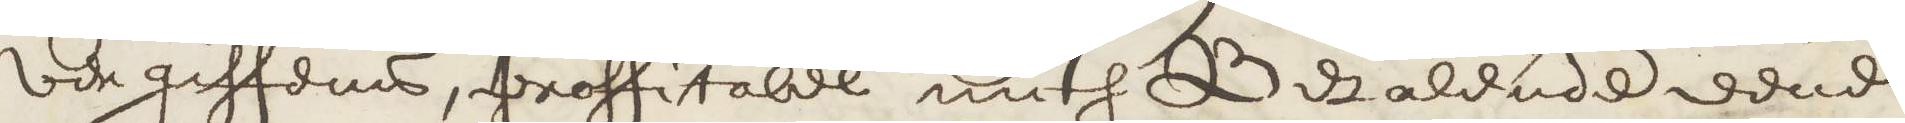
vergiffenis, proffitabel mits Betalende eene
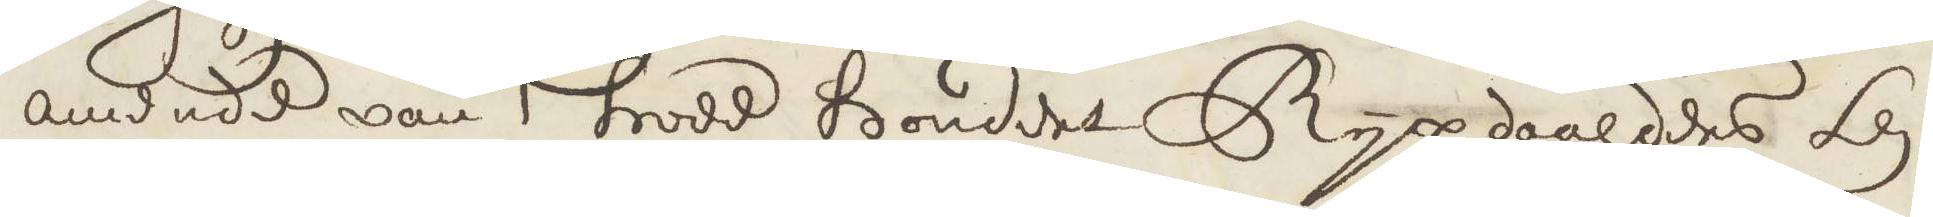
amende van twee hondert Rijcx daalders ten
